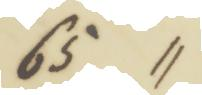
65 „
